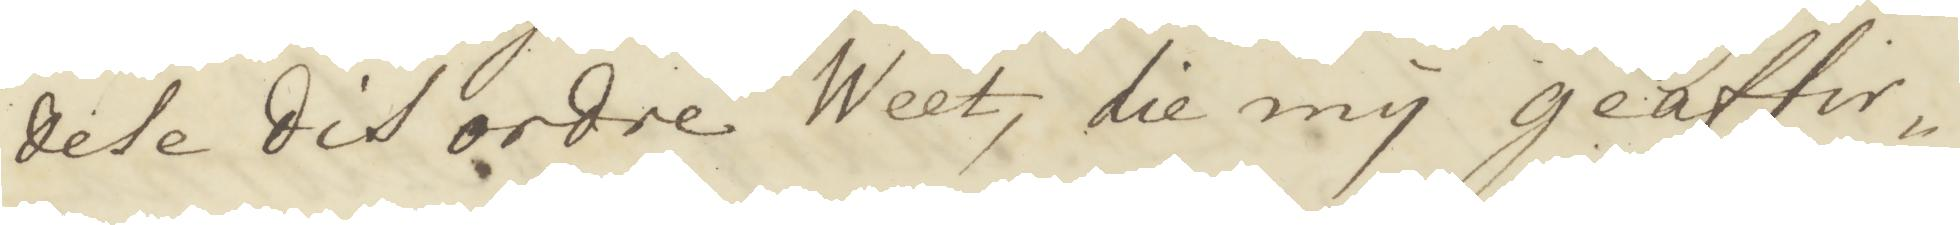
dese dis ordre weet, die mij geaffir„
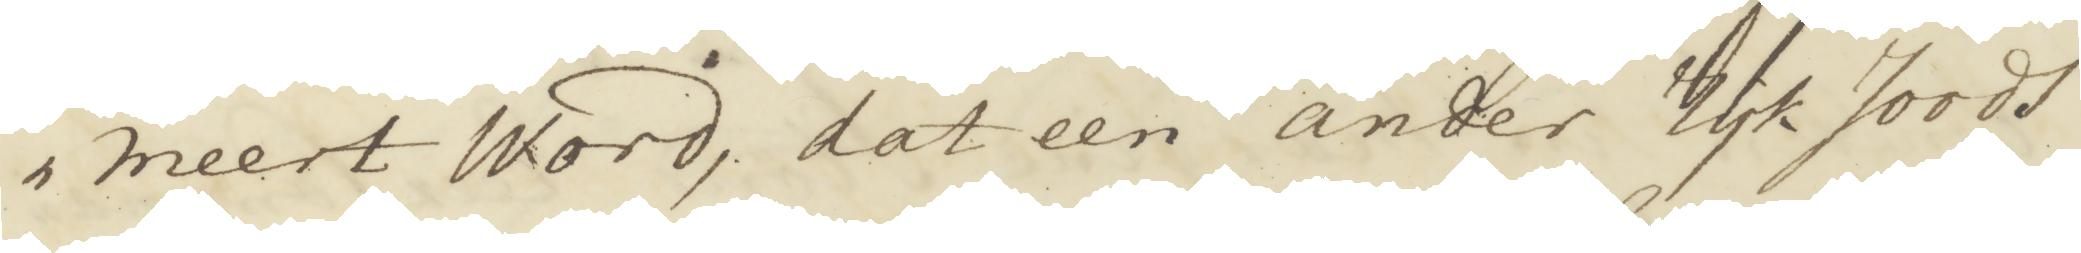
„meert word, dat een ander rijk Joods
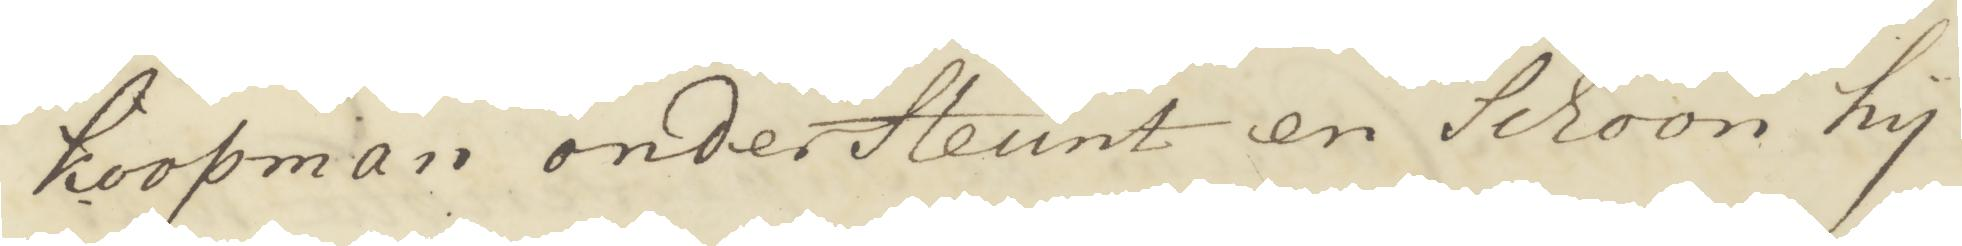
koopman ondersteunt en schoon hij
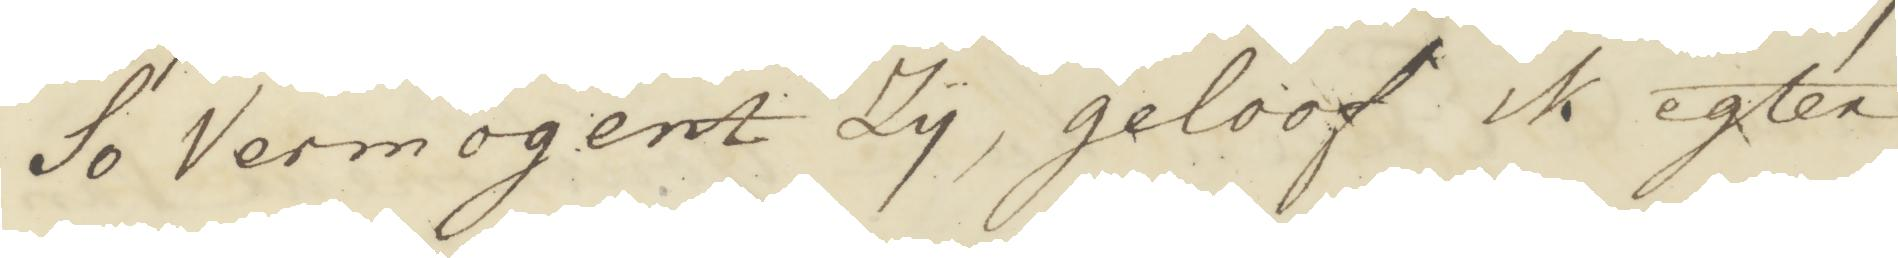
so vermogent zij, geloof ik egter
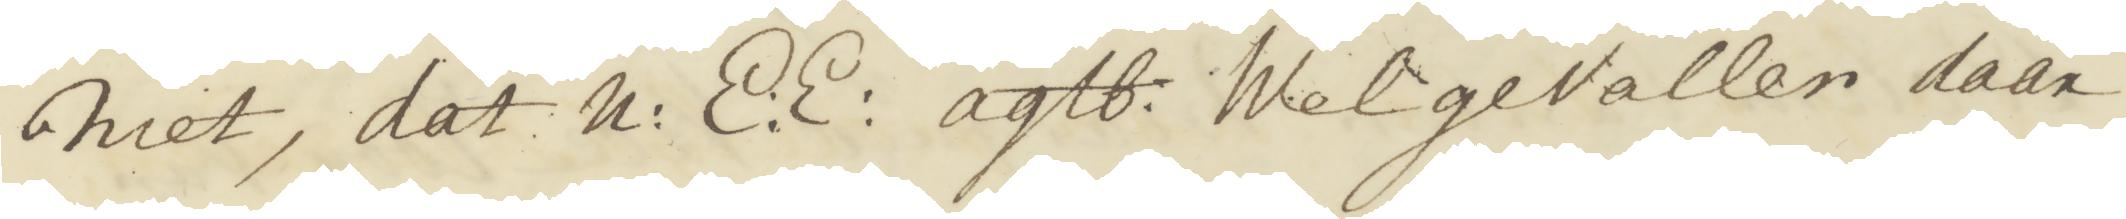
niet, dat u: E:E: agtb: welgevallen daar
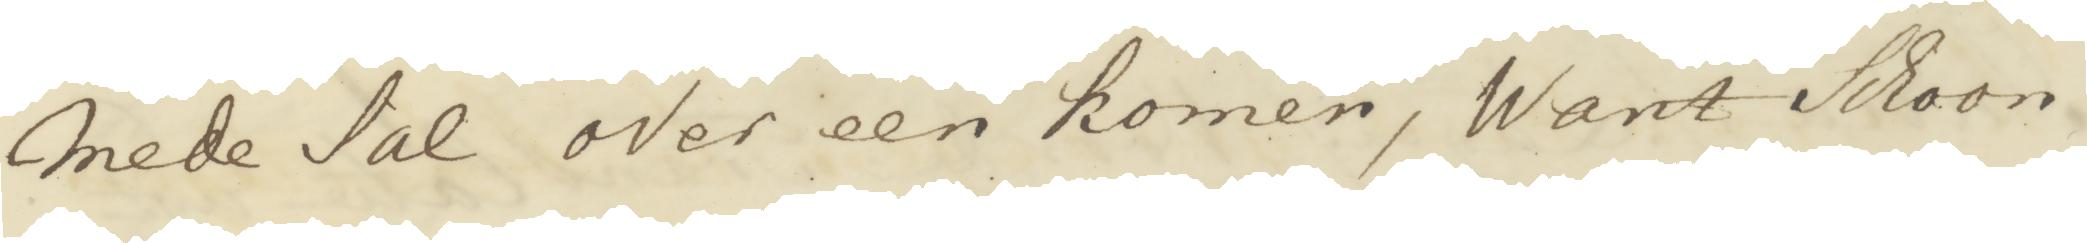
mede sal over een komen, want schoon
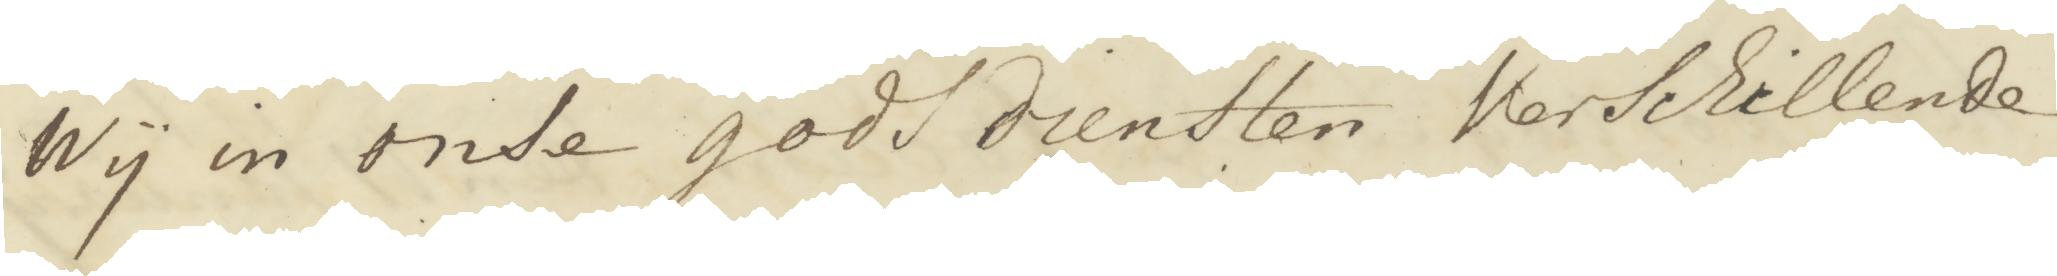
wij in onse gods diensten verschillende
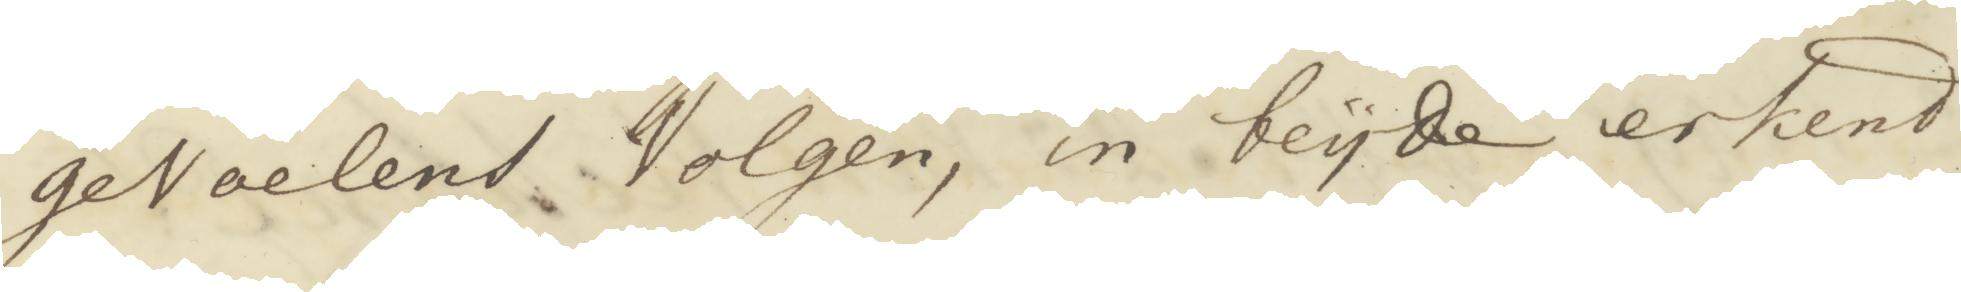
gevoelens volgen, in beijde erkend
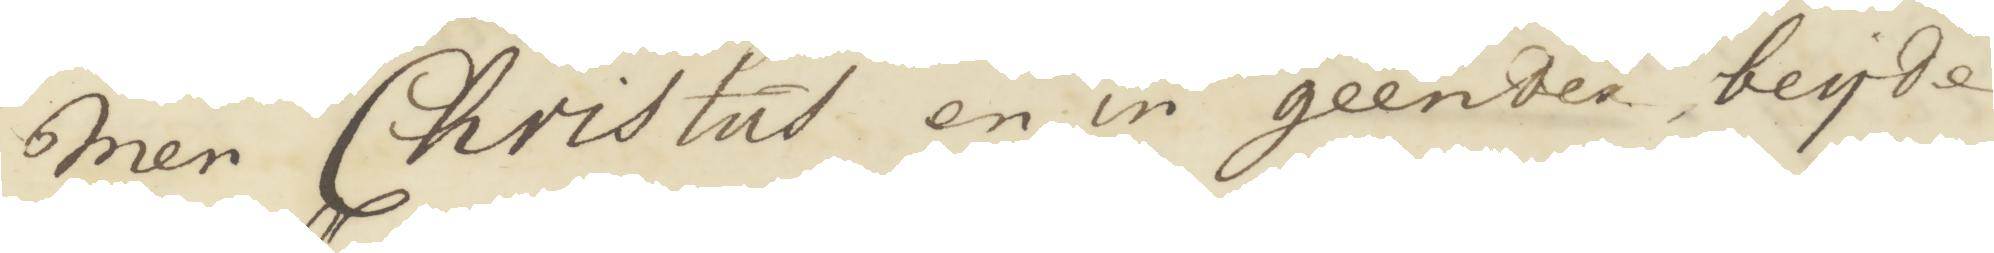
men Christus en in geender beijden
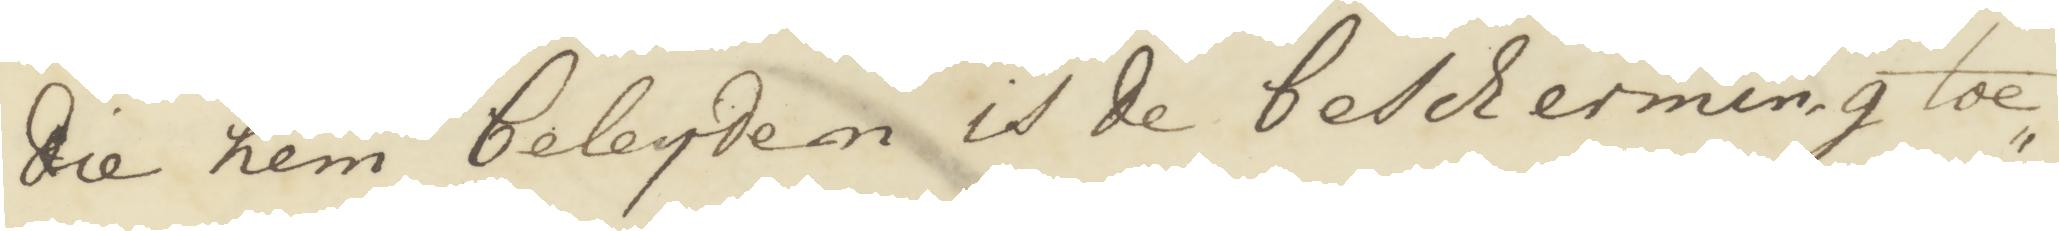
die hem beleijden is de bescherming toe„
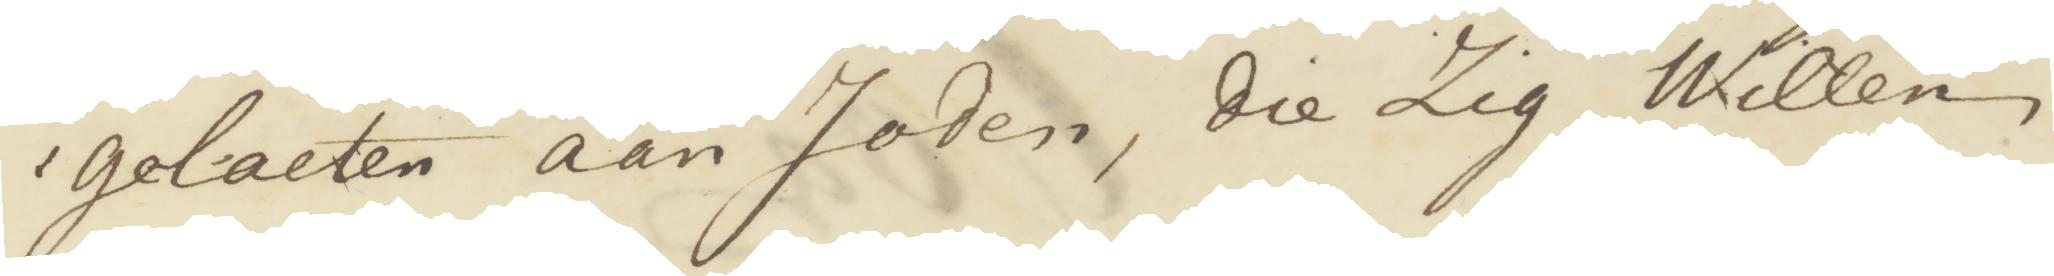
„gelaeten aan Joden, die zig willen
